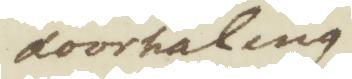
doorhaling
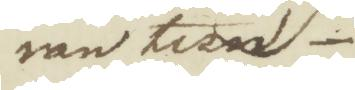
van tien–
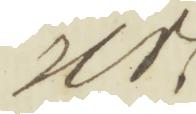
Wr
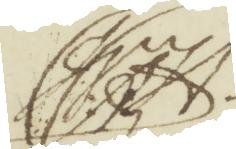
W:A:H
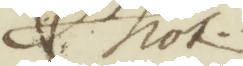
Not.
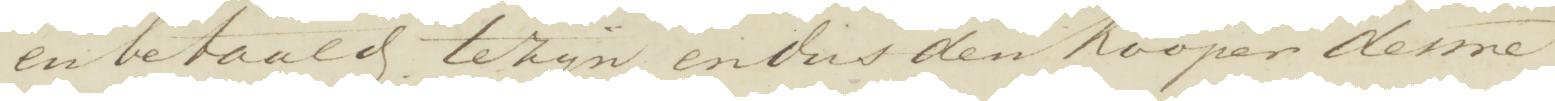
en betaald te zijn en dus den kooper deswe
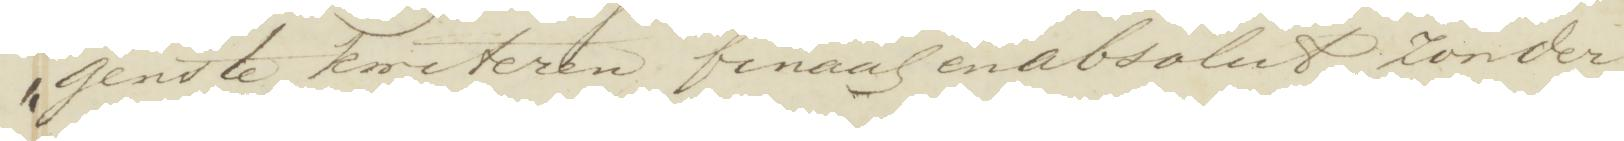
„gens te kwiteren finaal en absolut zonder
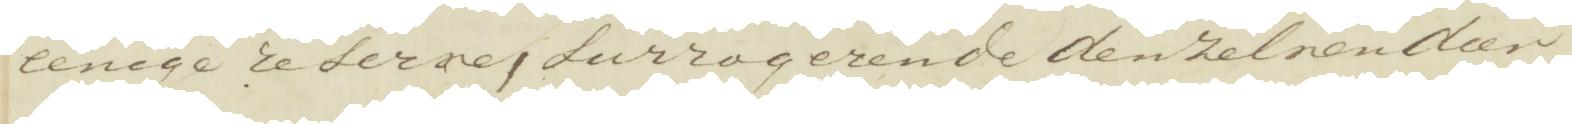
Eenige reserve, surrogerende den zelven dien
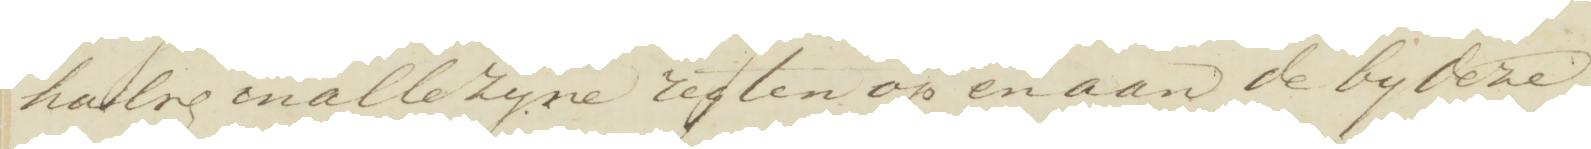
halve in alle zijne regten op en aan de by deze
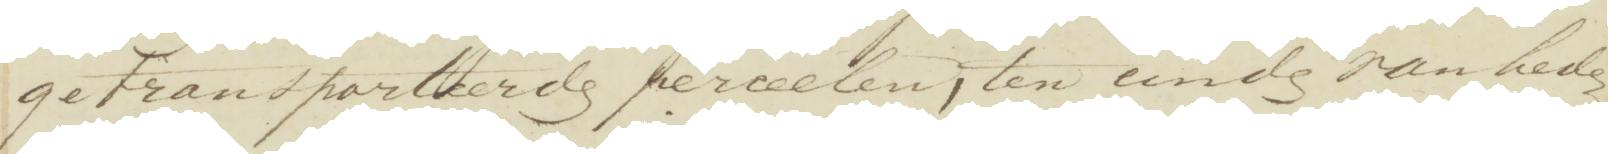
getransporteerde perceelen, ten einde van heden
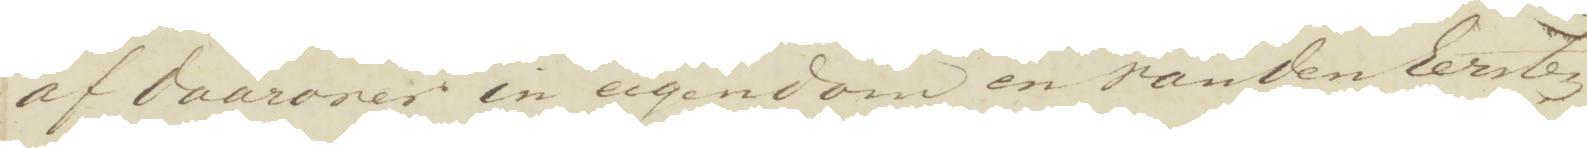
af daarover in eigendom en van den Eersten
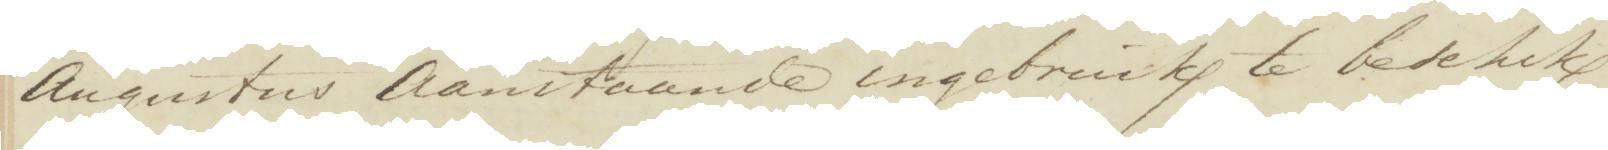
Augustus Aanstaande ingebruik te beschik
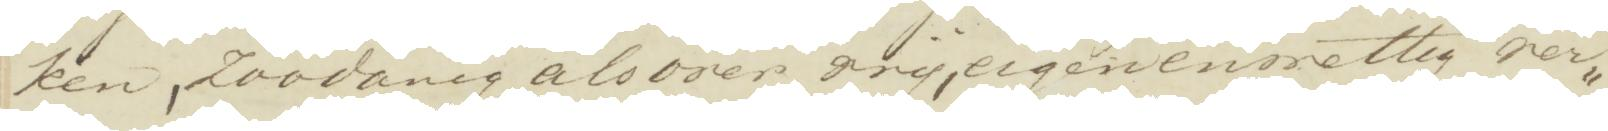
ken, zoodanig als over vrij, eigen en wettig ver„
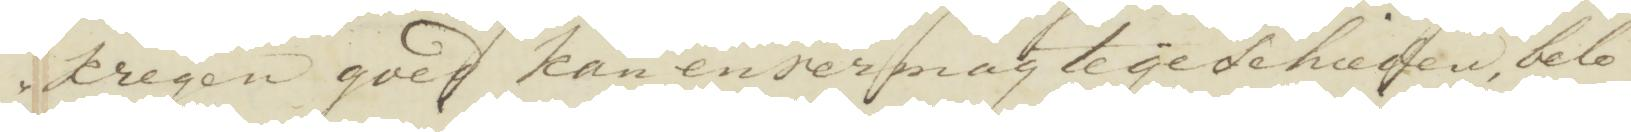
„kregen goed kan en vermag te geschieden, belo
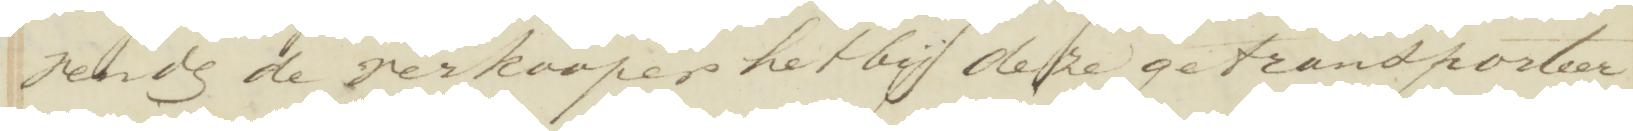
vende de verkooper het bij deze getransporteer
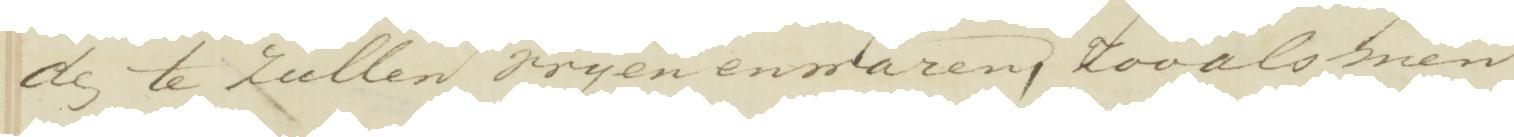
de te zullen vrijen en waren, zoo als men
